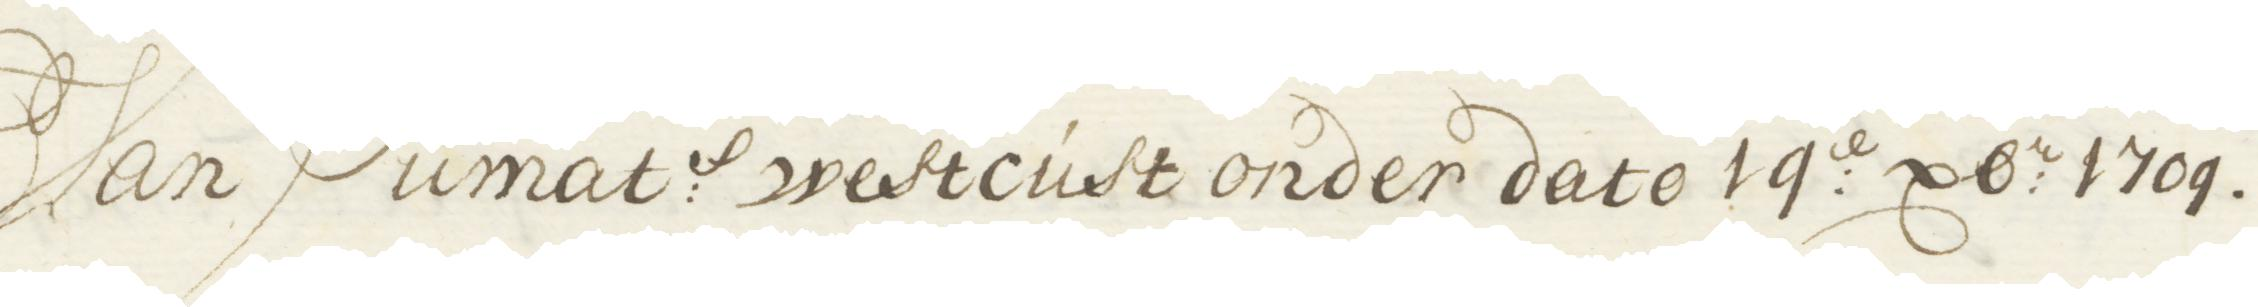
Van Sumat:s westcust onder dato 19:e xb:r 1704.
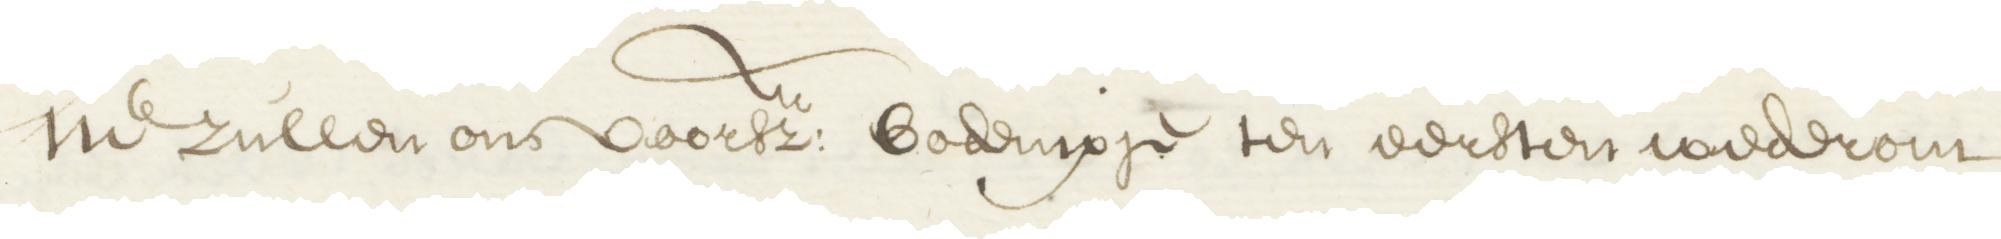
ue zullen ons voorsz: bodempje ten eersten wederom
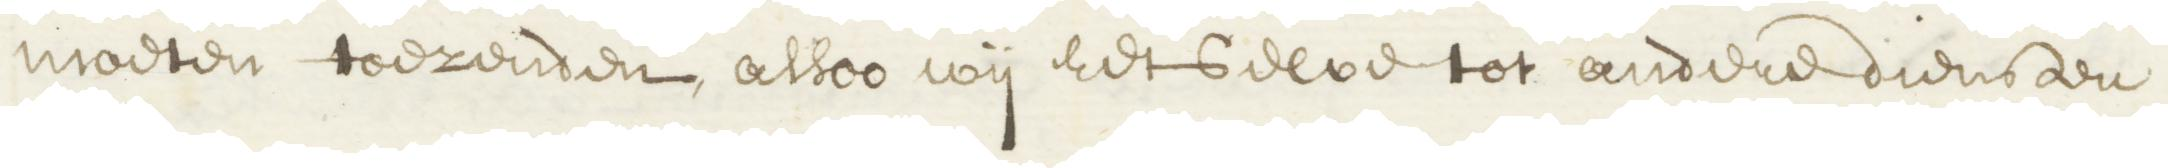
moeten toezenden, alsoo wij het selve tot andere diensten
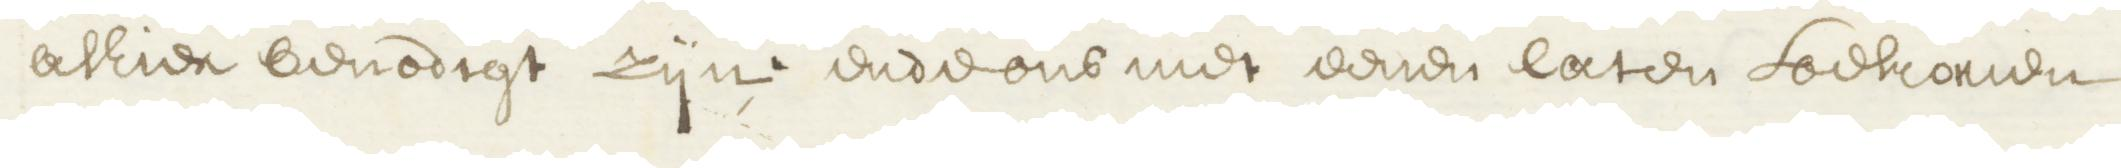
alhier benodigt zijn. ende ons met eenen laten toekomen
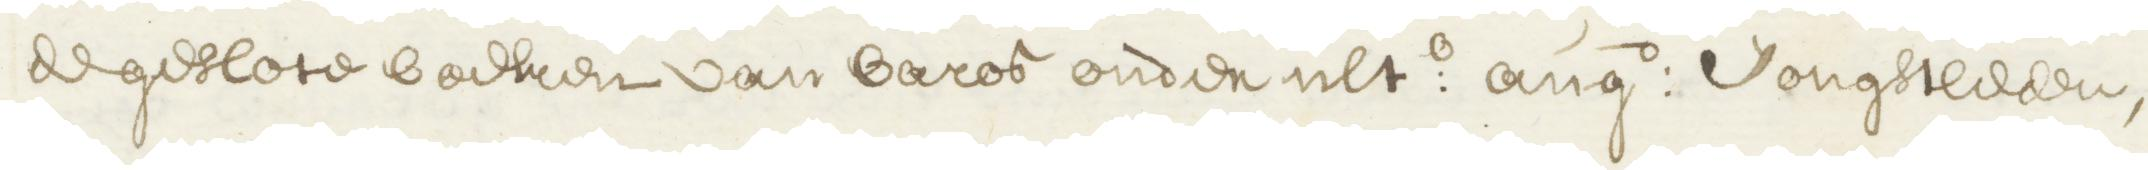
de geslote boeken van baros onder ult:o aug:o jongstleden,
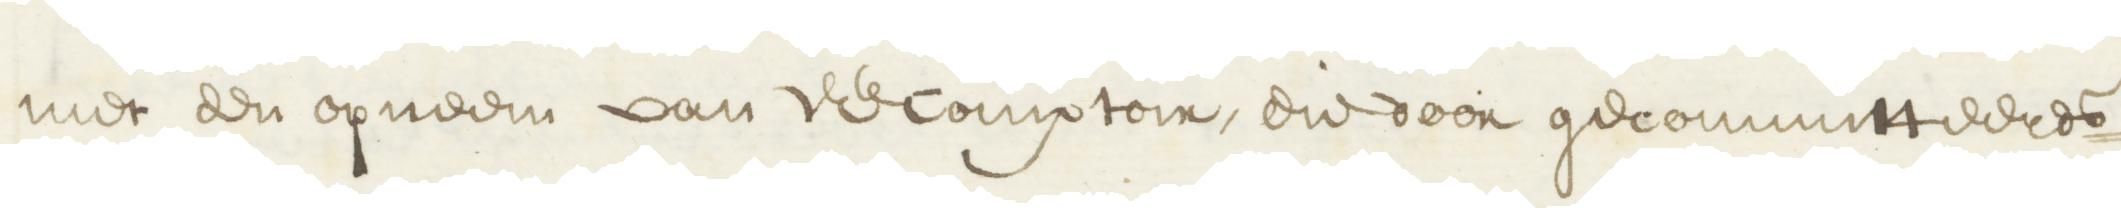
met den op neem van ue comptoir, die door gecommitteerde
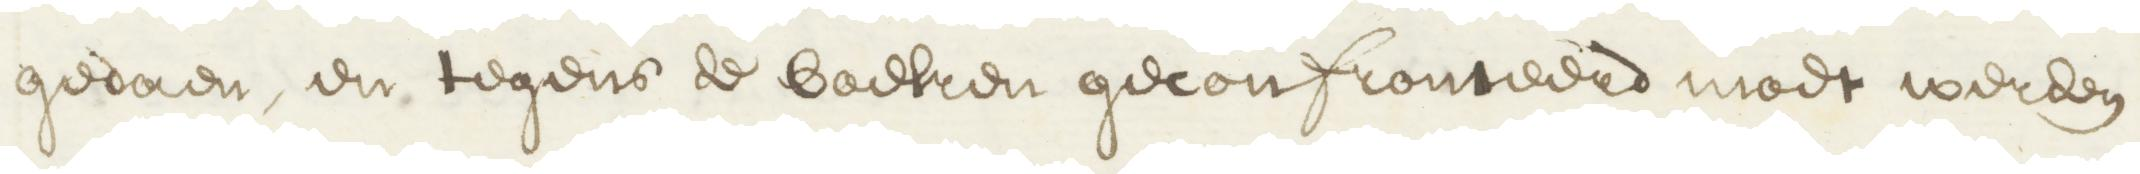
gedaen, en tegens de boeken geconfronteerd moet werden
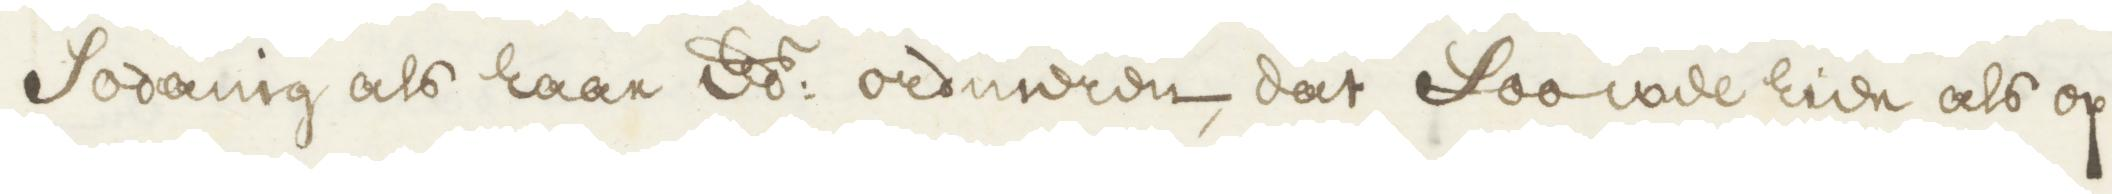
sodanig als haar Eds: ordineren, dat soo wel hier als op
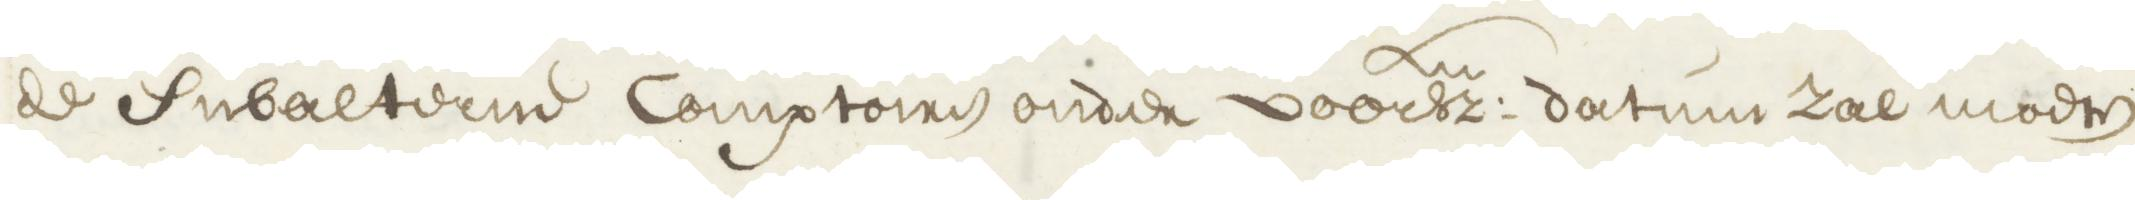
de subalterne Comptoire onder voorsz: datum zal moeten
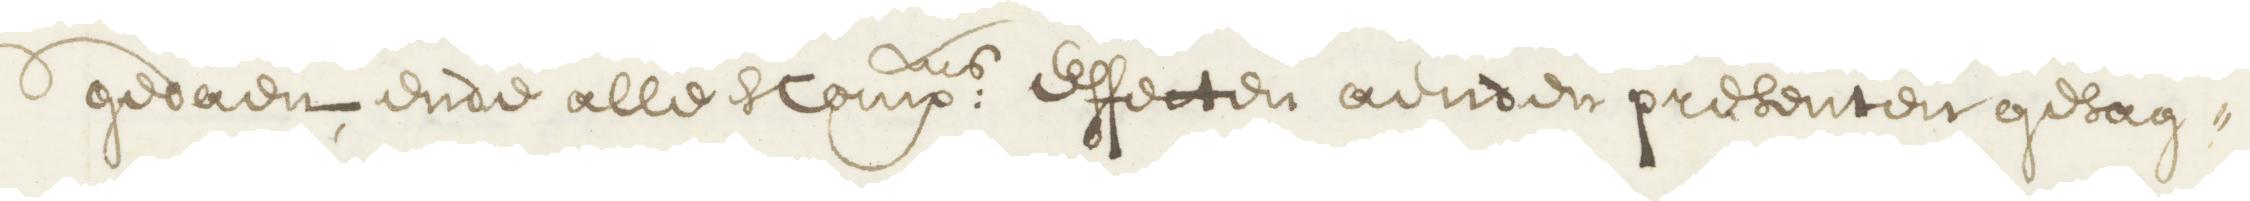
gedaen, ende alle ’s Comp:s Effecten aenden presenten gesag„
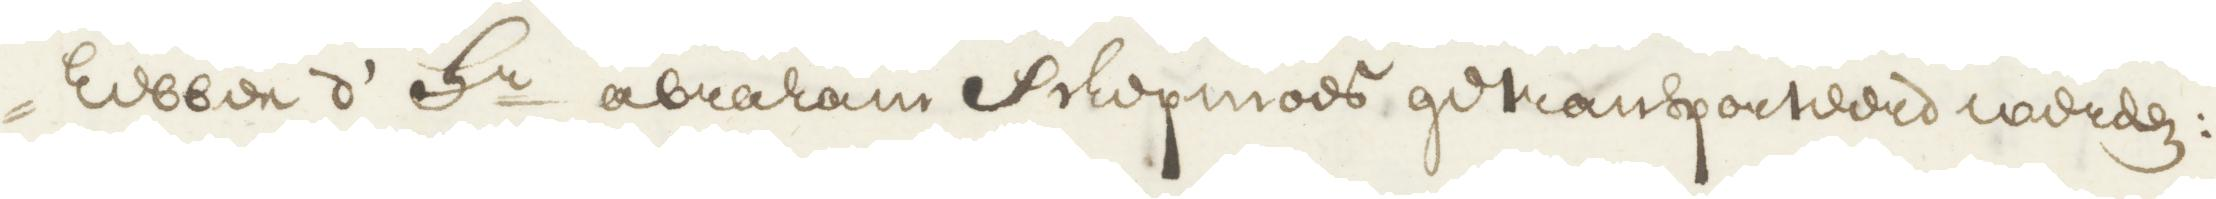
„hebber d’ H=r Abraham schepmoes getransporteerd werden:
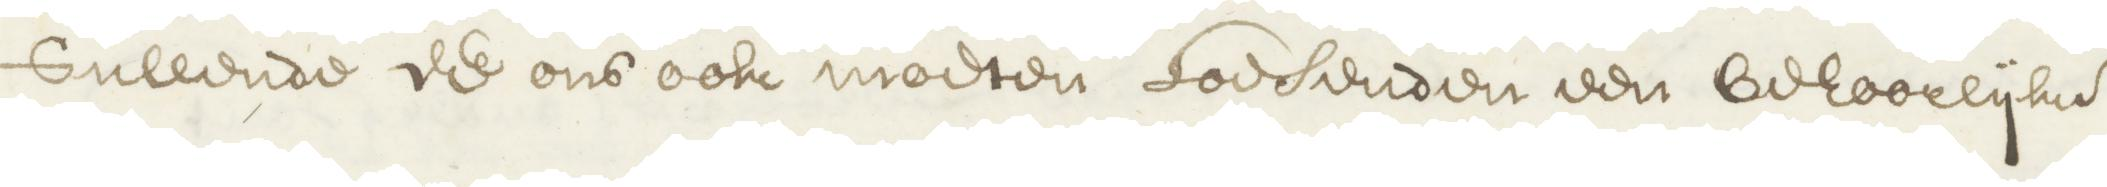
Sullende ue ons ook moeten toesenden een behoorlijke
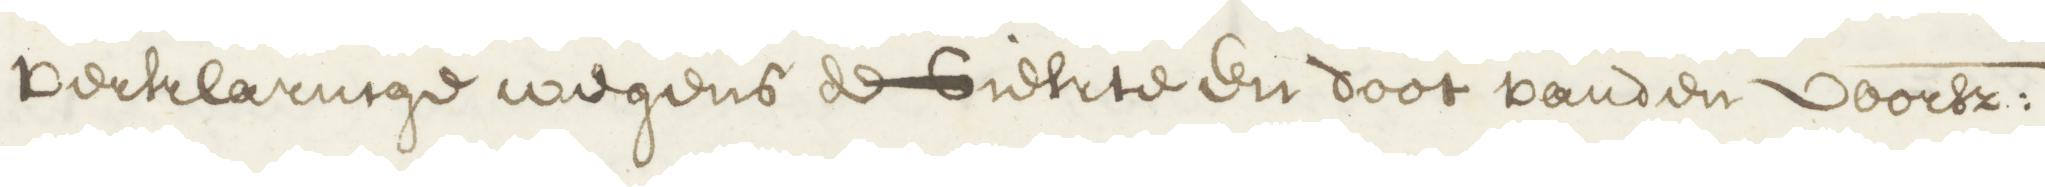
verklaringe wegens de siekte en doot vanden voorsz:
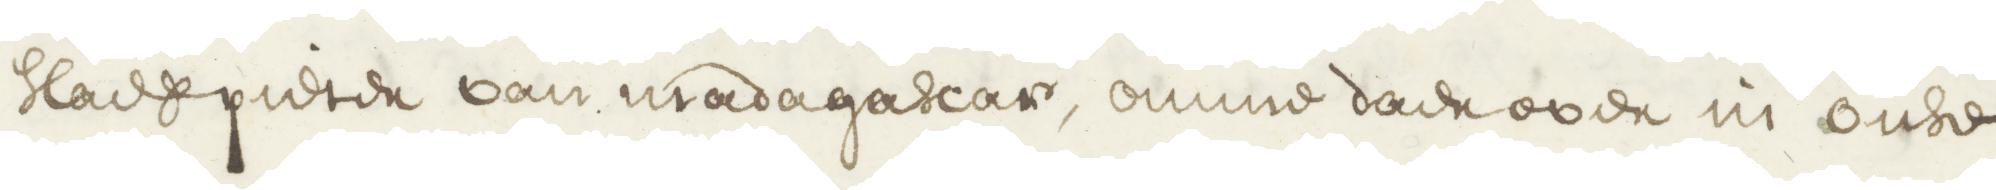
slaef pieter van madagascar, omme daerover in onse
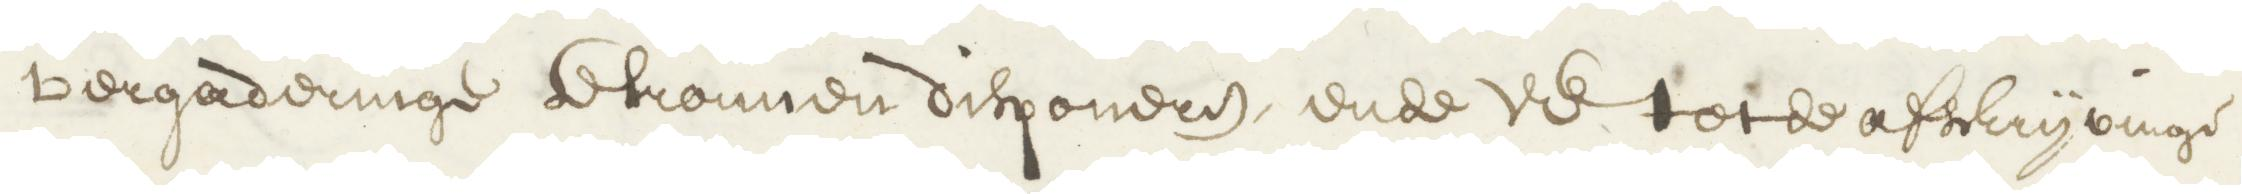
vergaderinge tekonnen disponeren, ende ue tot de afschrijvinge
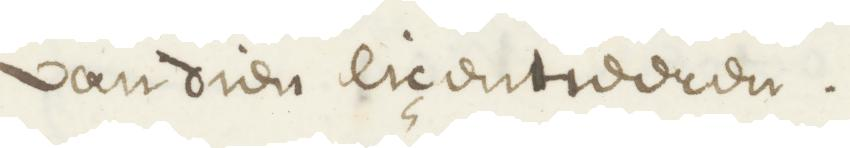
van dien licentieeren.
